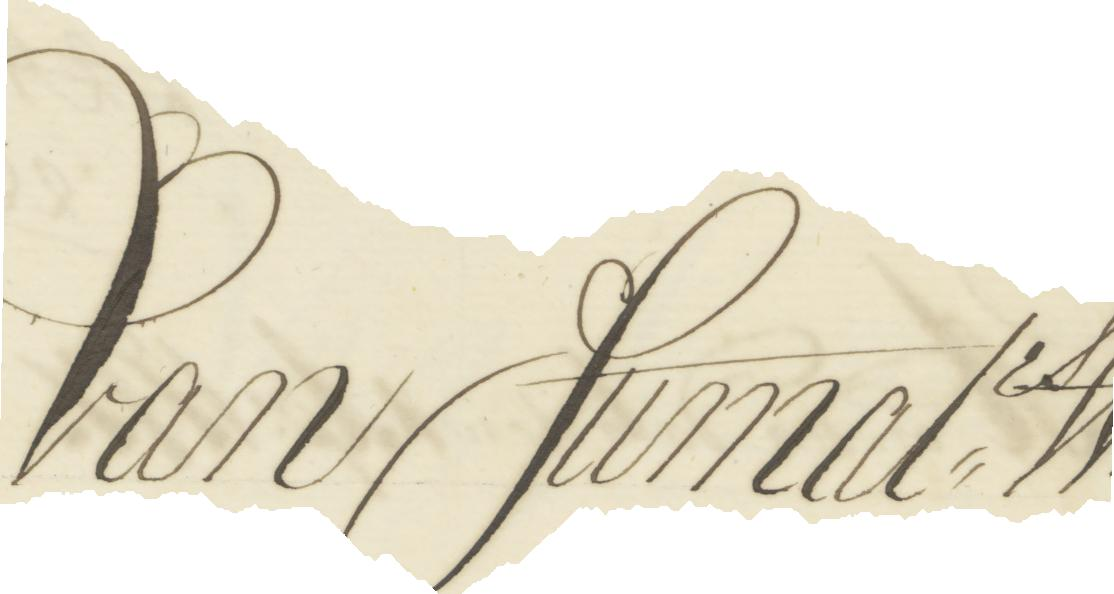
Van Sumat„s W„t Cust onder dato den 11 Ap: 1747.
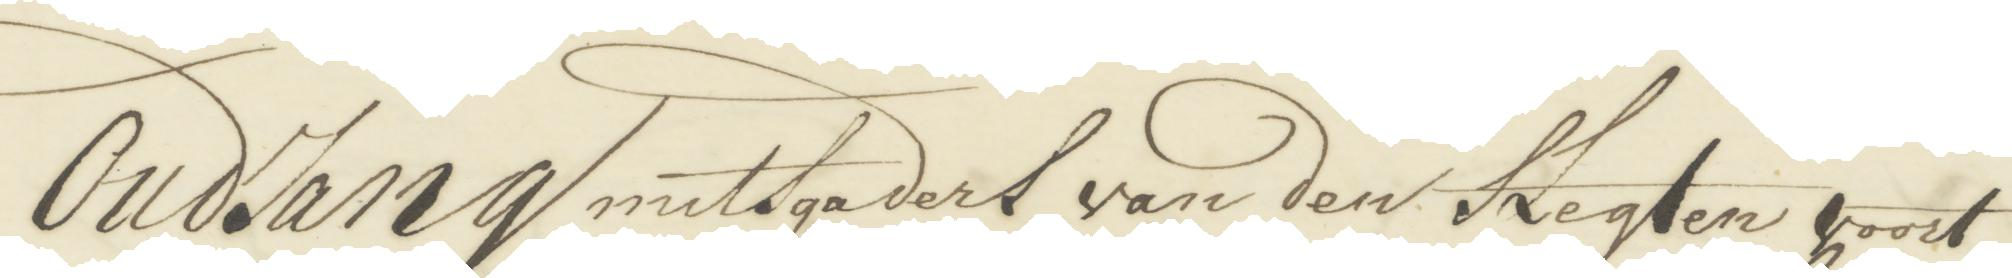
Oudjang mitsgaders van den slegten voort
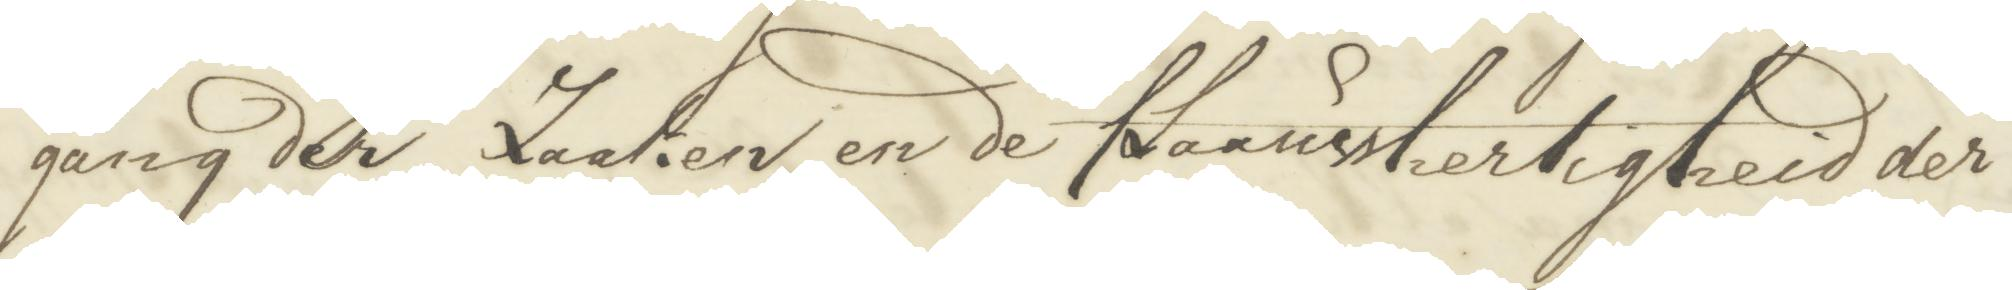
gang der zaaken, en de flaauwhertigheid der
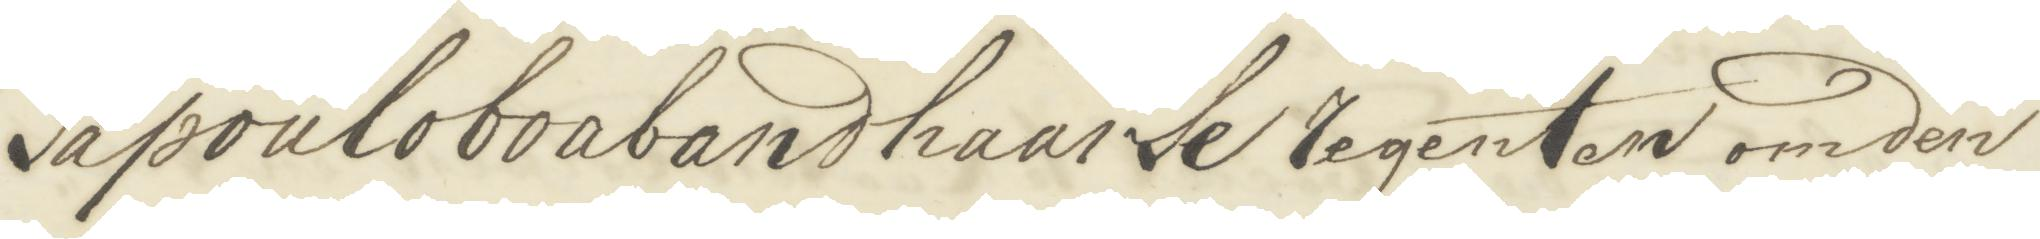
Sapouloboabandhaarse regenten om den
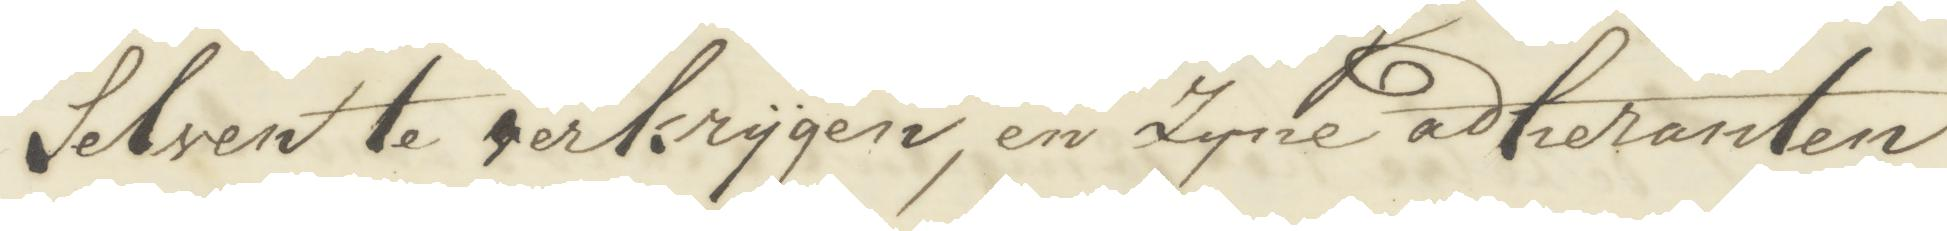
selven te verkrijgen, en zijne adheranten
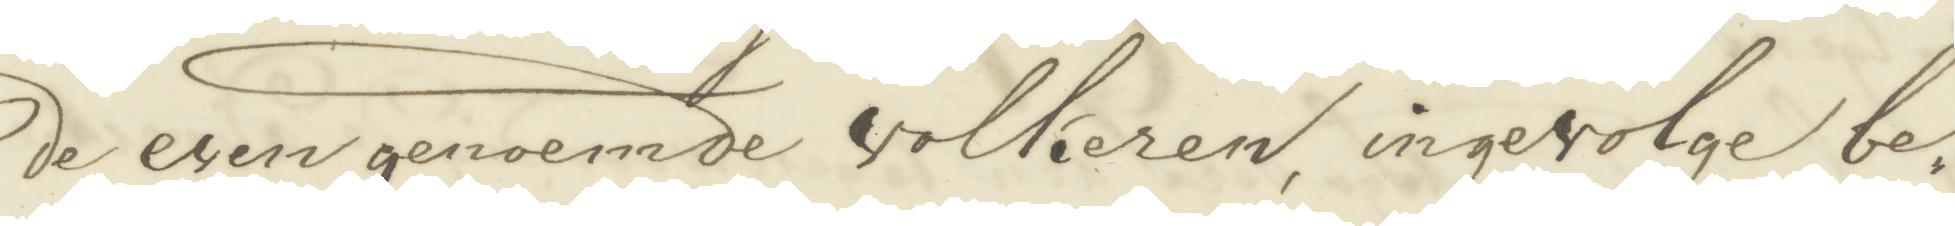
de even genoemde volkeren, ingevolge be„
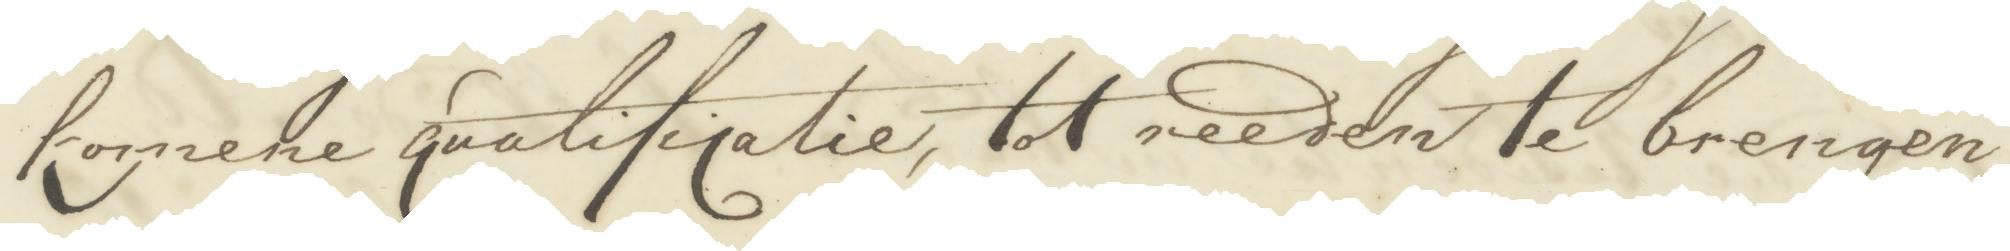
komene qualificatie tot reeden te brengen,
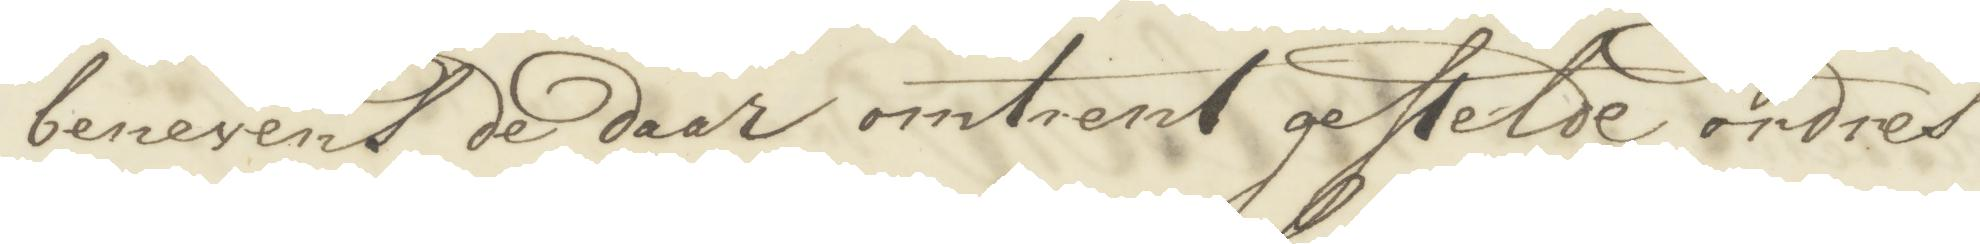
benevens de daar omtrent gestelde ondres
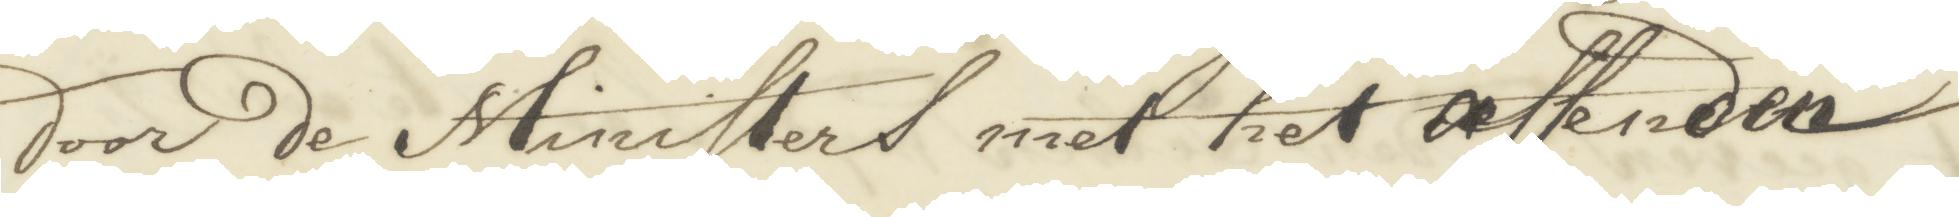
door de Ministers met het afsenden
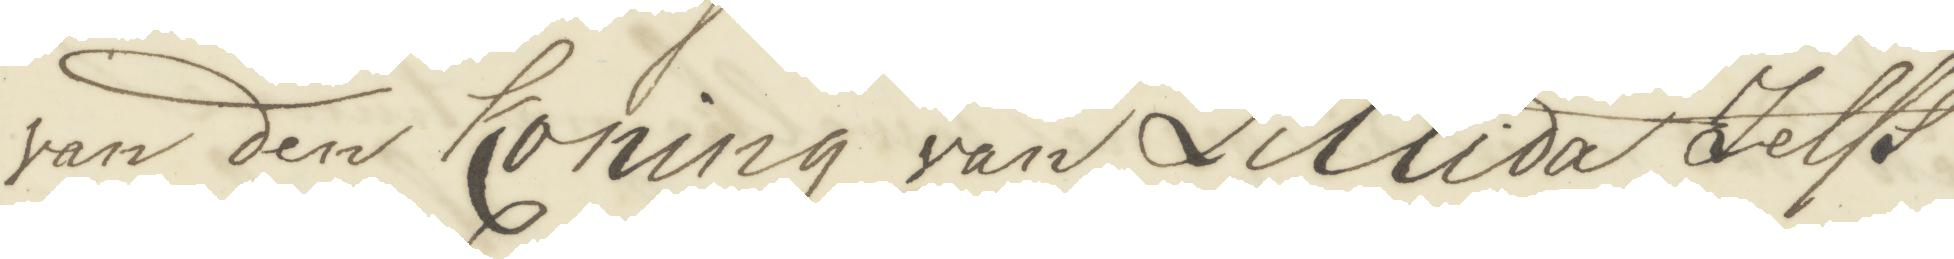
van den koning van Zillida zelfs
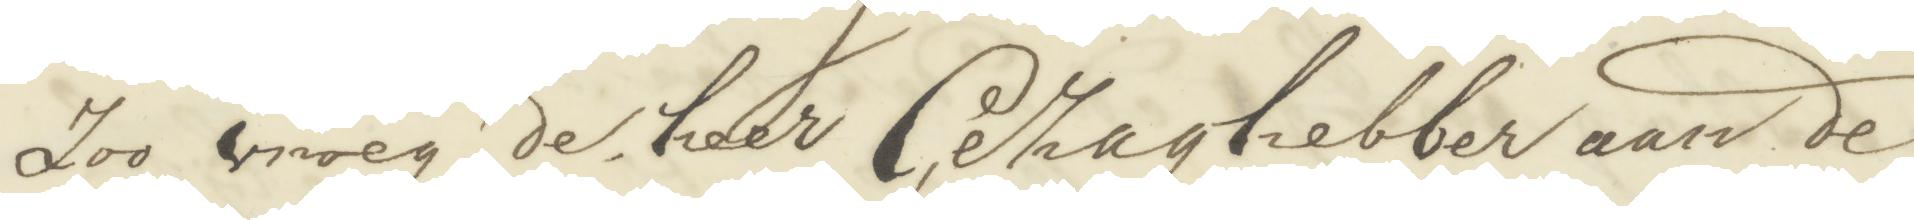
zoo vroeg de heer Gezaghebber aan de
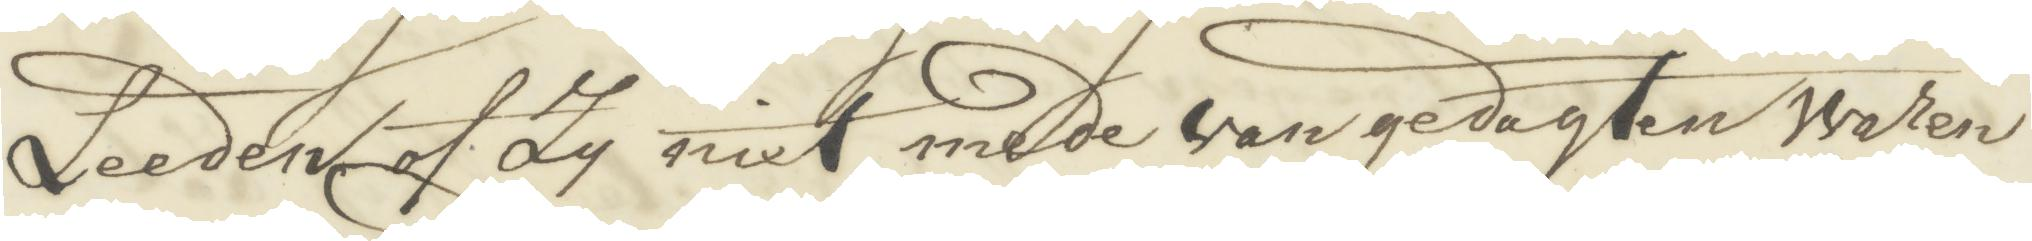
Leeden of zy niet mede van gedagten waren
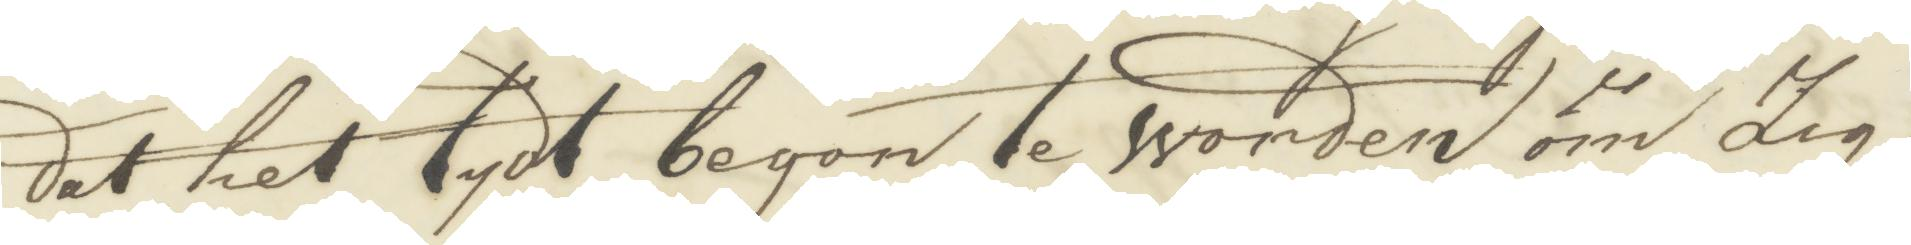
dat het tydt begon te worden om zig
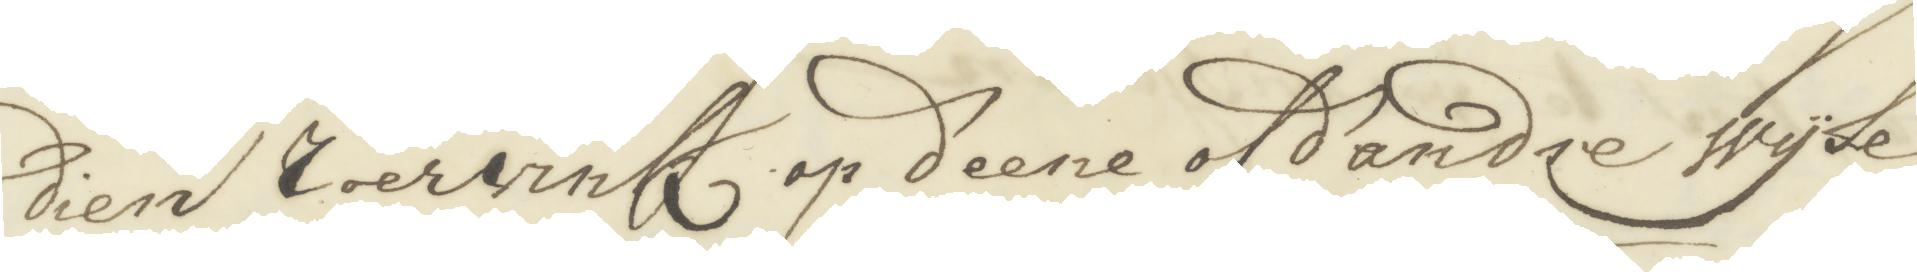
dien roervink op d’eene of d'andre wijse
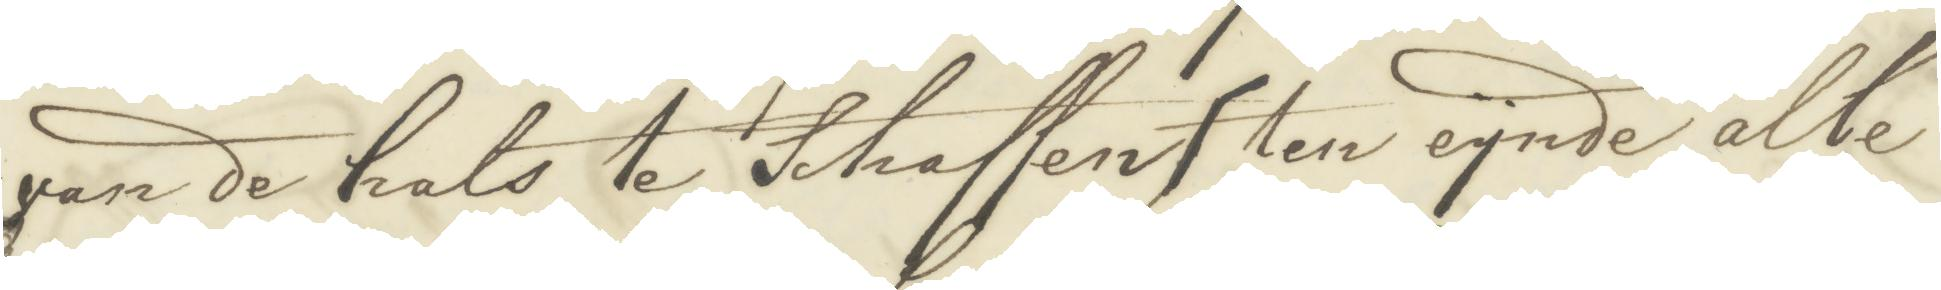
van de hals te schaffen ¶ ten eijnde alle
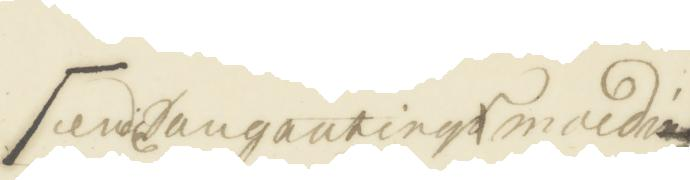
¶ ende van gartings moeding
